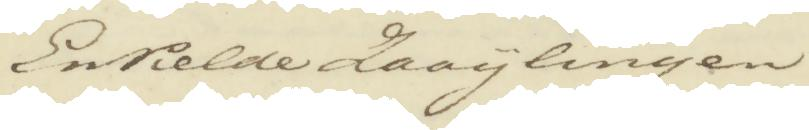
Enkelde Zaaijlingen
